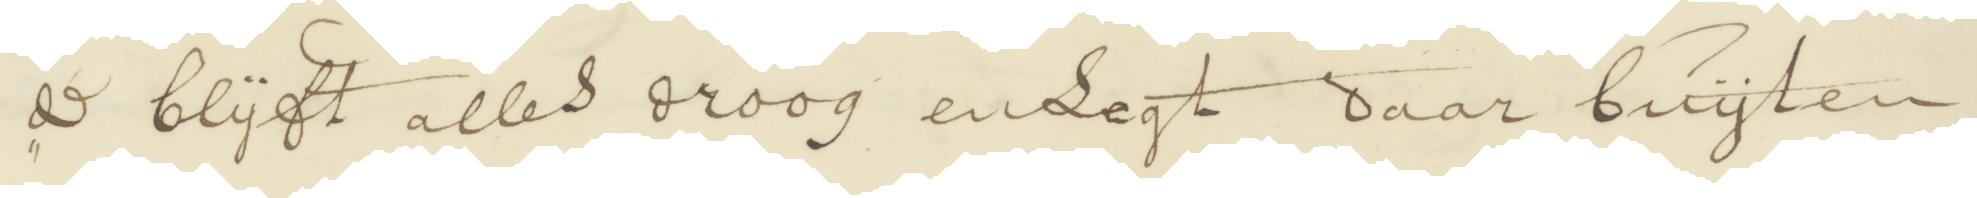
„de blijft alles droog en Legt daar buijten
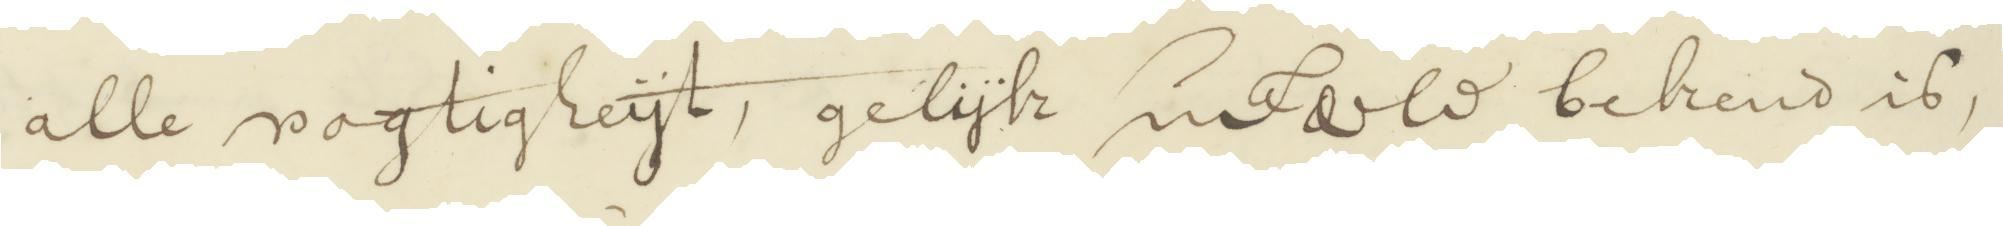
alle vogtigheijt, gelijk u Edele bekend is,
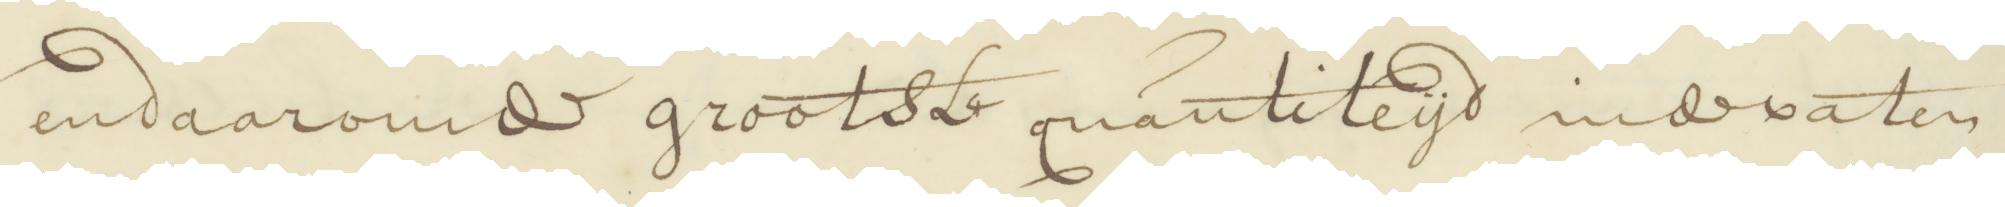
en daarom de grootste quantiteijd in de vaten
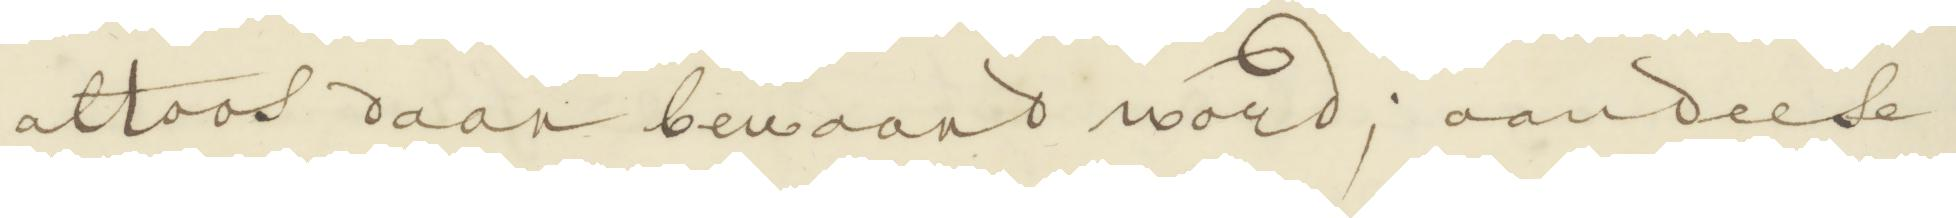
altoos daar bewaard word; aan deese
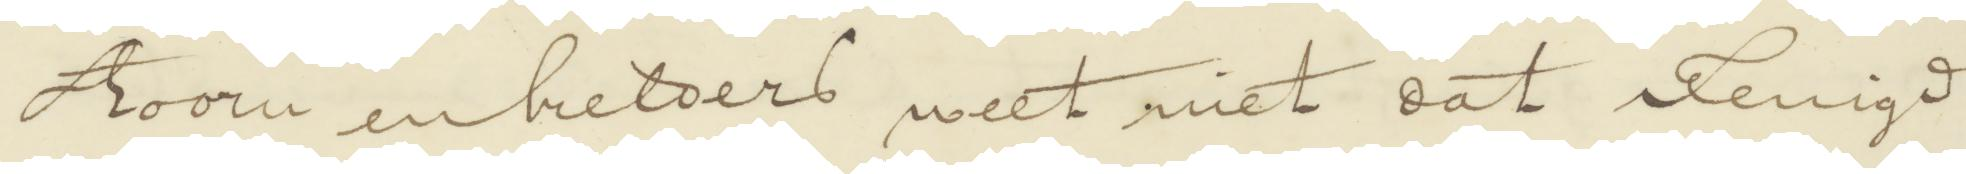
thoorn en kelders weet niet dat Eenige
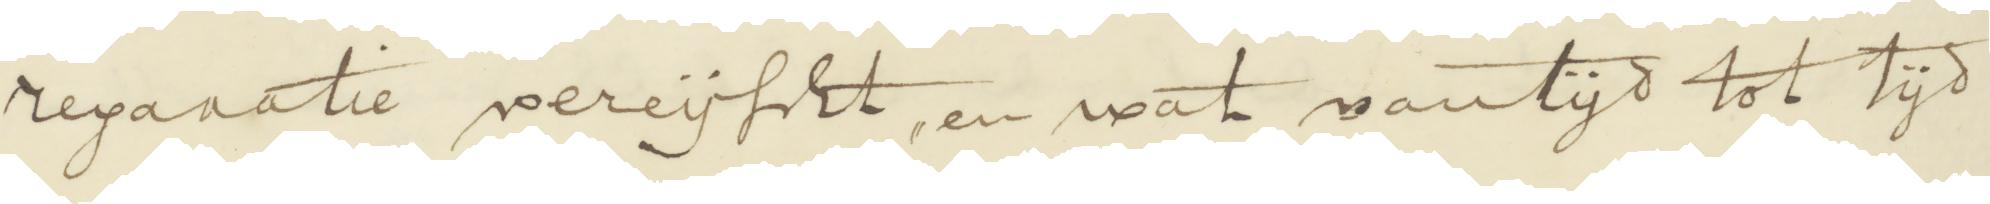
reparatie vereijscht„ en wat van tijd tot tijd
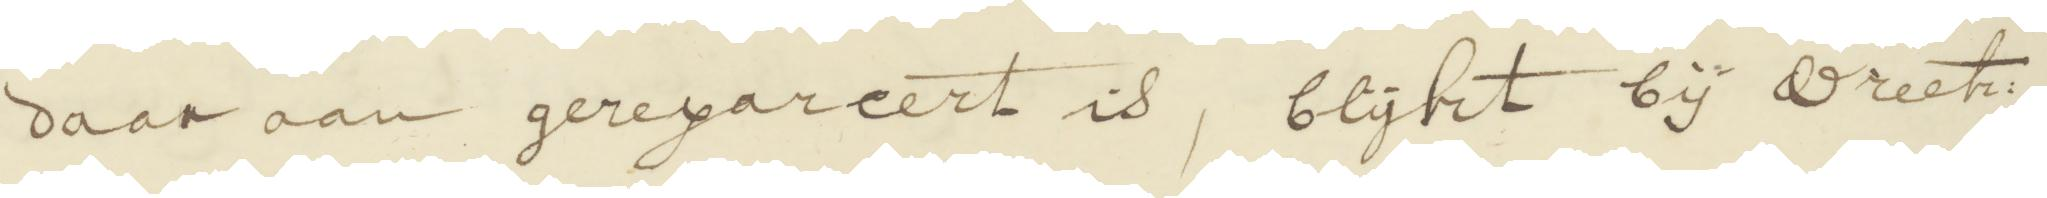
daar aan gerepareert is, blijkt bij de reek:
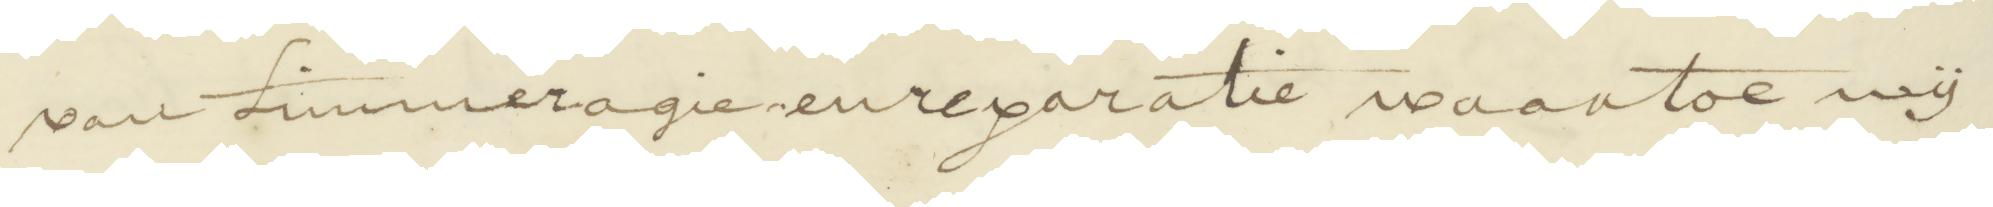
van timmeragie en reparatie waar toe wij
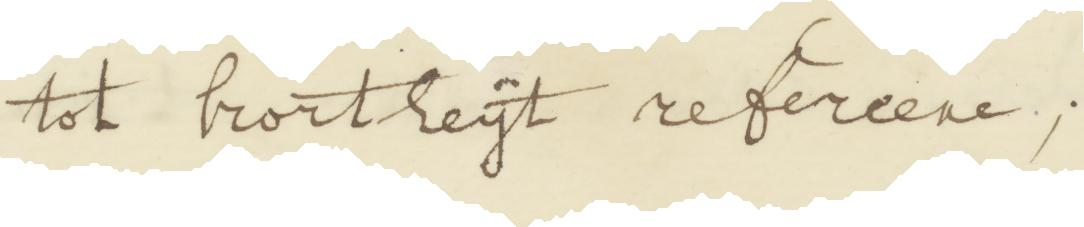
tot kortheijt refereer,
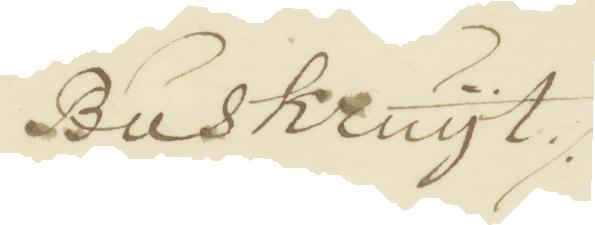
Buskruijt./.
